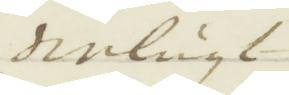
Nvlugt
